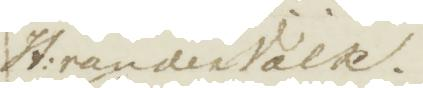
H: van der Valk.
